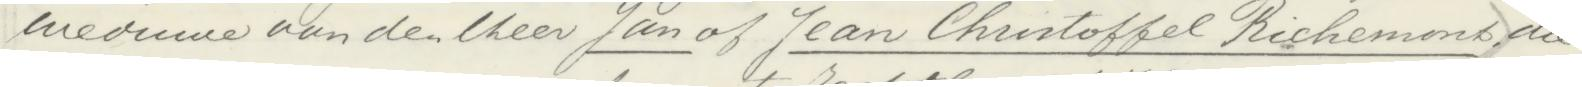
weduwe van den Heer Jan of Jean Christoffel Richemont, die
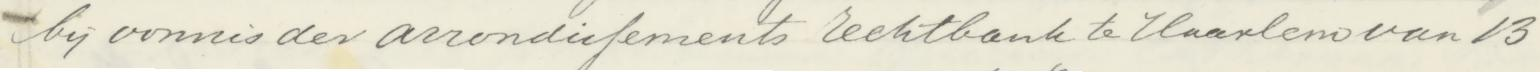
bij vonnis der arrondissements rechtbank te Haarlem van 13
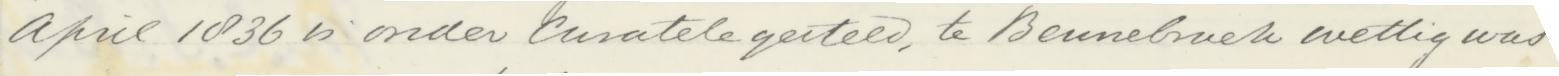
april 1836 is onder curatele gesteld, te Beunebroek wettig was
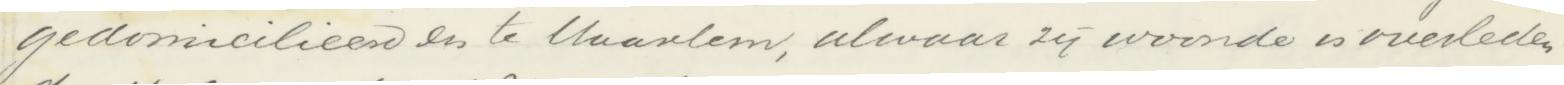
gedomicilieerd en te Haarlem, alwaar zij woonde is overleden
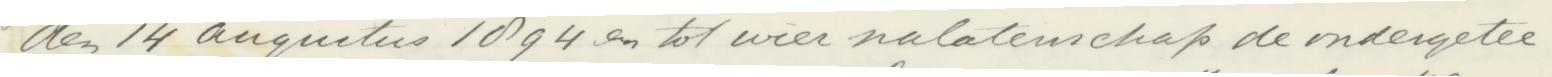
den 14 augustus 1894 en tot wier nalatenschap de ondergetee
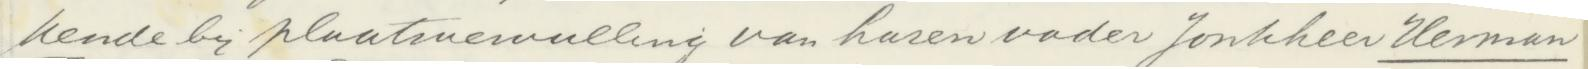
kende bij plaatsvervulling van haren vader Jonkheer Herman
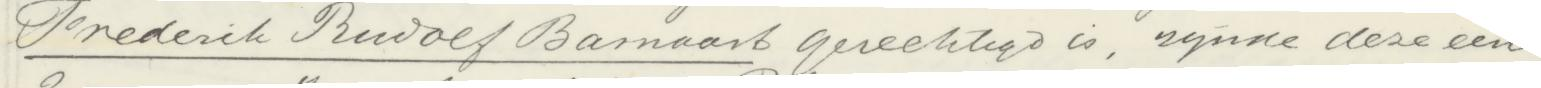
Frederik Rudolf Barnaart gerechtigd is, zynde deze een
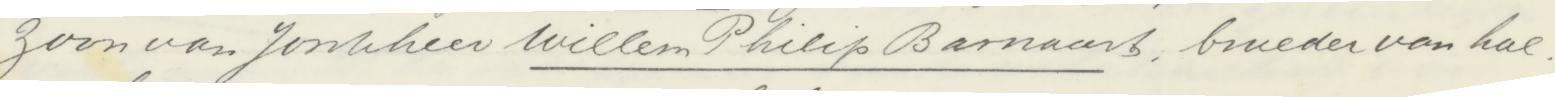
zoon van Jonkheer Willem Philip Barnaart, broeder van hal
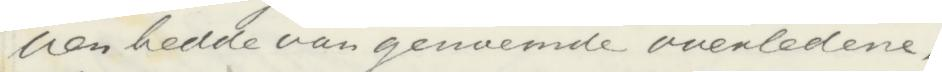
ven bedde van genoemde overledene,
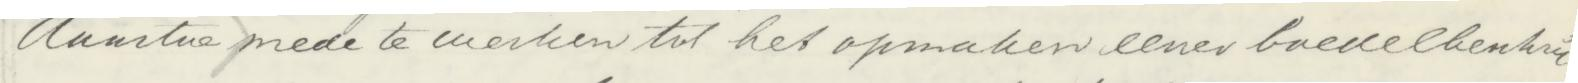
daartoe mede te werken tot het opmaken eener boedelbeschrij
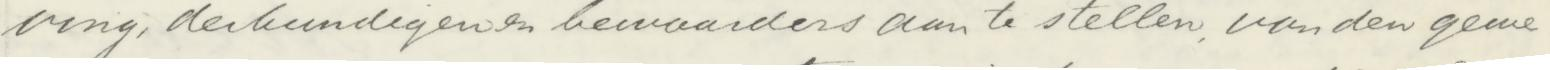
ving, deskundigen en bewaarders aan te stellen, van den gewe
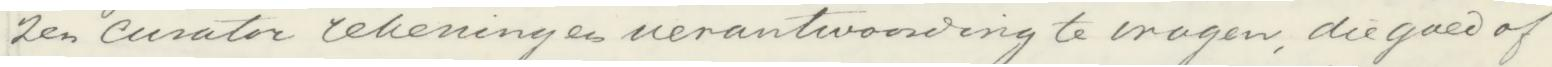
zen curator rekening en verantwoording te vragen, die goed of
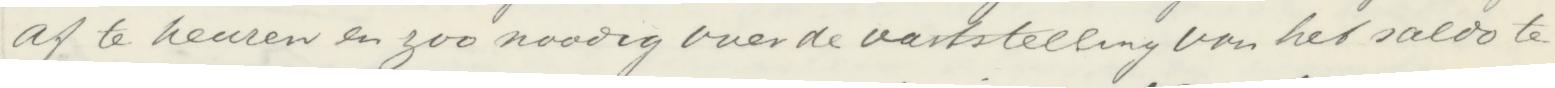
af te keuren en zoo noodig over de vaststelling van het saldo te
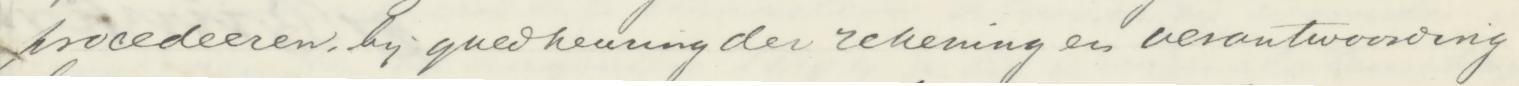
procedeeren, bij goedkeuring der rekening en verantwoording
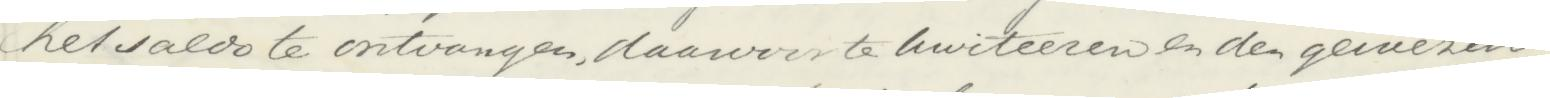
het saldo te ontvangen, daarvoor te kwiteeren en den gewezen
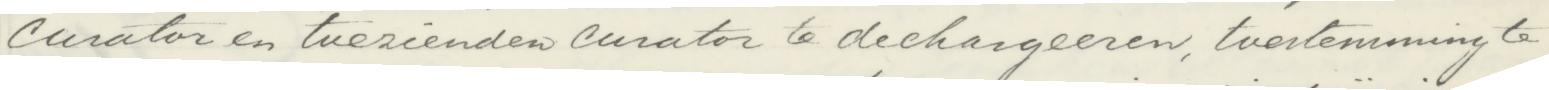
curator en toezienden curator te dechargeeren, toestemming te
